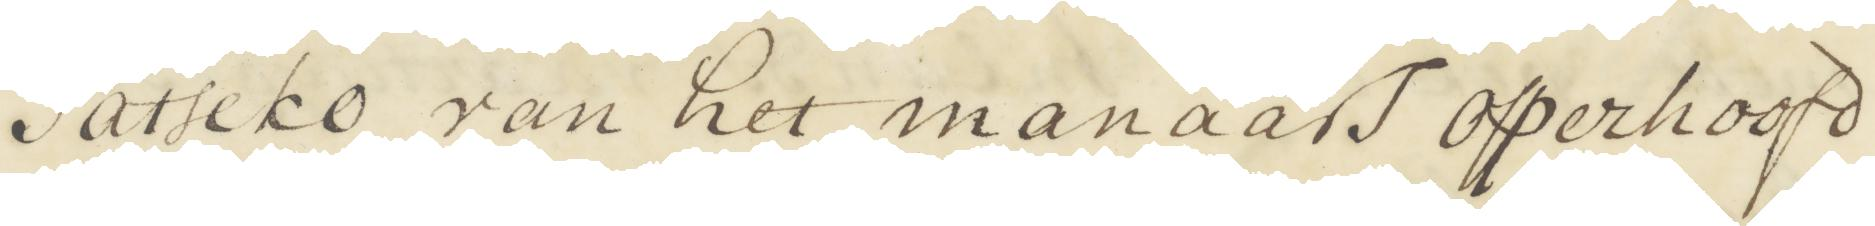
Patseko van het manaars opperhoofd
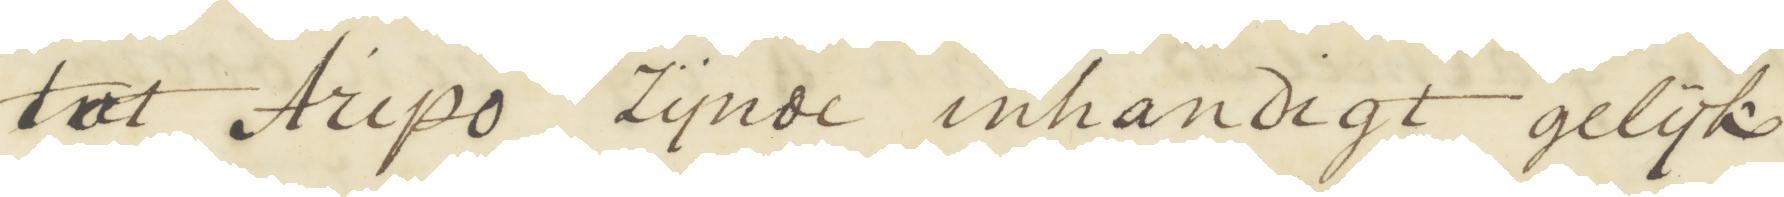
tot Aripo zijnde inhandigt gelijk
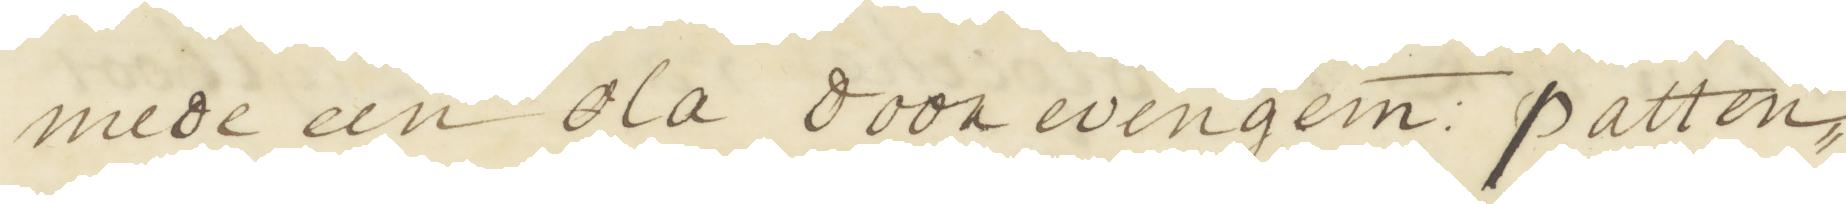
mede een ola door evengem: patten„
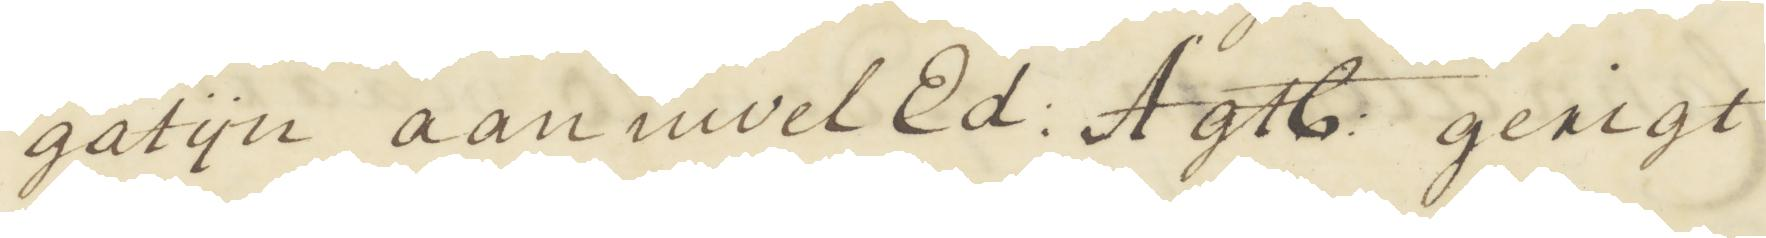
gatijn aan uwel Ed: Agtb: gerigt
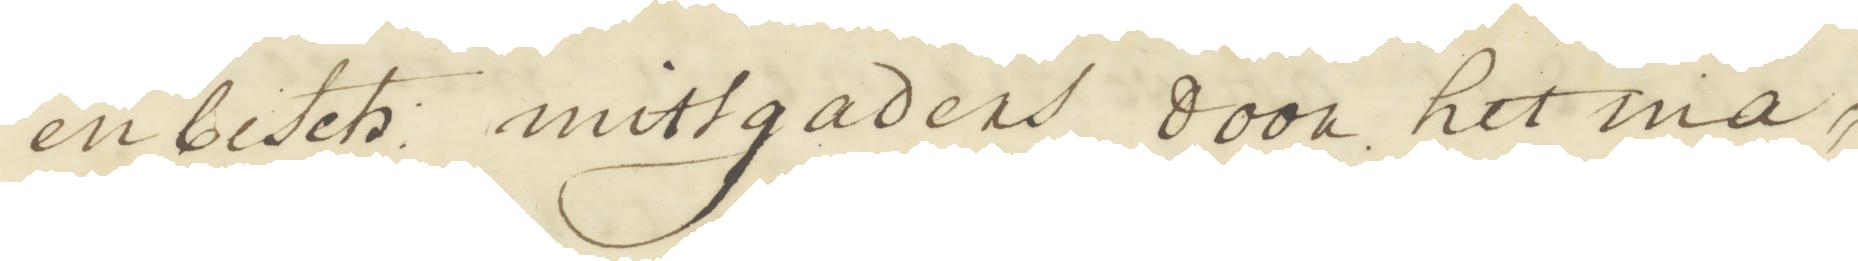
en besch: mitsgaders door het ma„
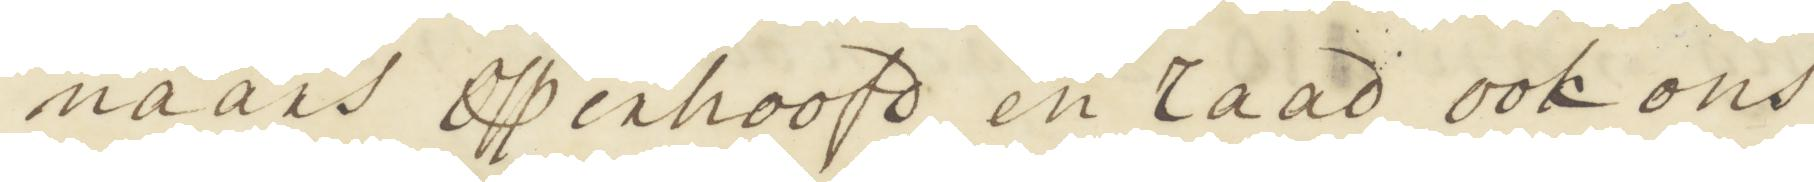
naars opperhoofd en Raad ook ons
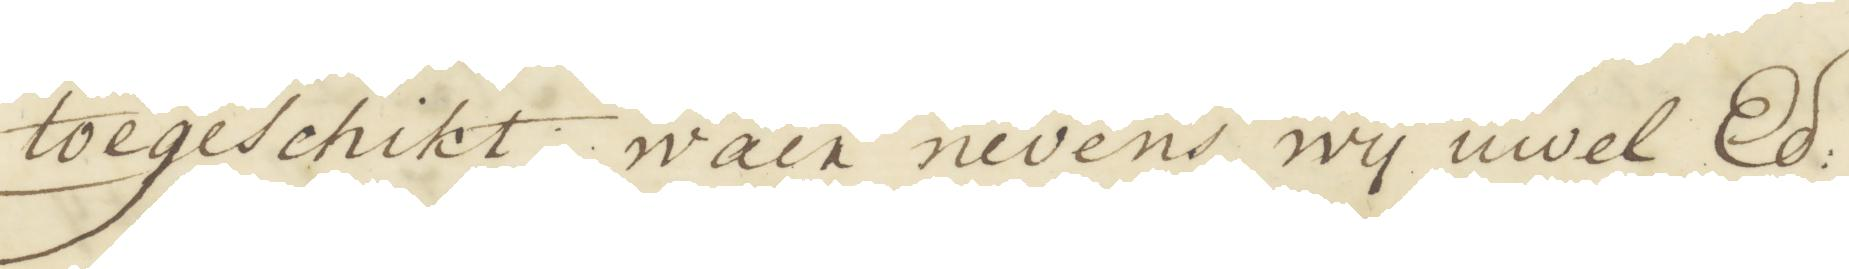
toegeschikt: waer nevens wij uwel Ed:
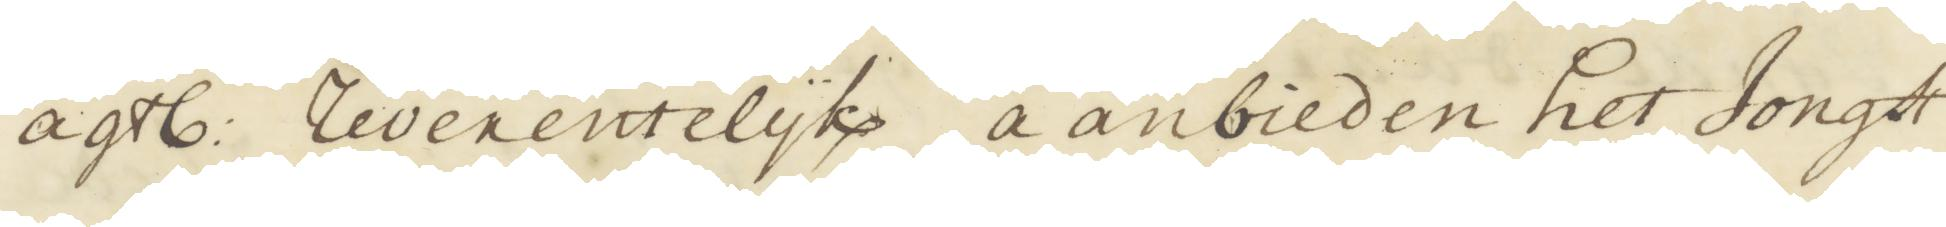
agtb: Reverentelijk aanbieden het Iongst
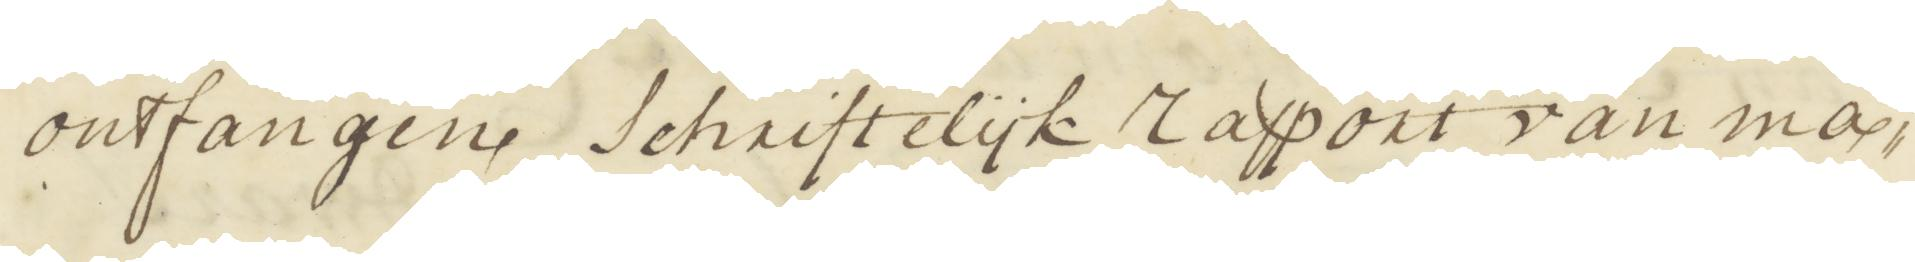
ontfangen schriftelijk rapport van ma„
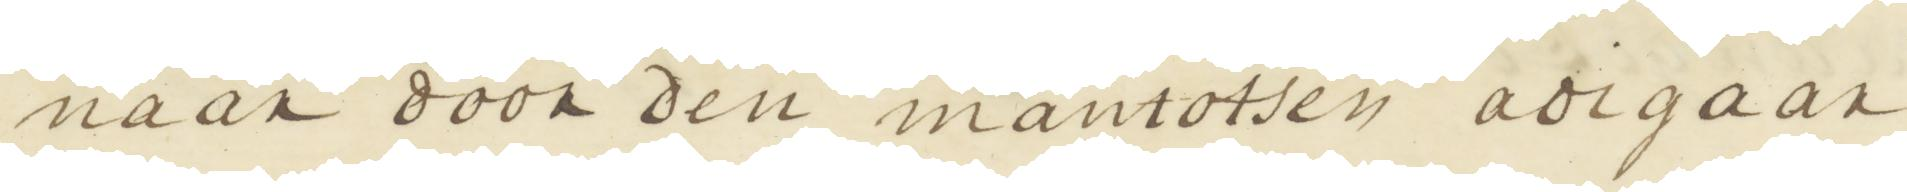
naar door den mantotsen adigaar
